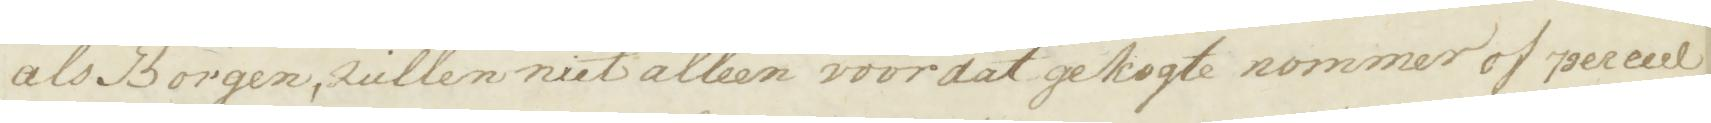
als Borgen, zullen niet alleen voor dat gekogte nommer of perceel
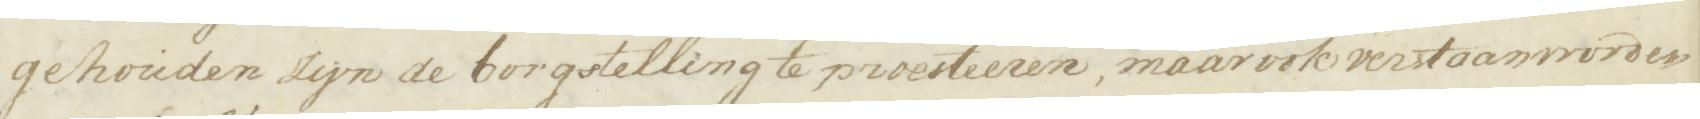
gehouden zijn de borgstelling te proesteeren, maar ook verstaan worden
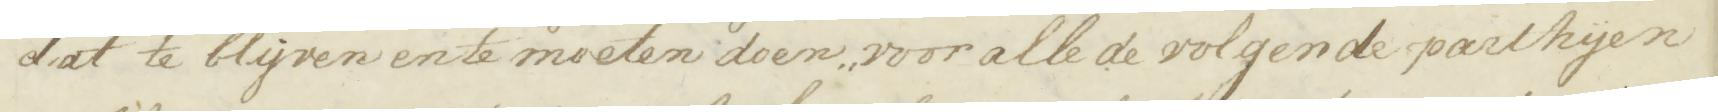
dat te blijven en te moeten doen, voor alle de volgende parthijen
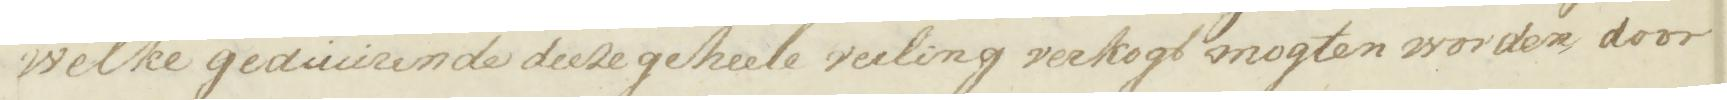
welke geduurende deeze geheele veiling verkogt mogten worden door
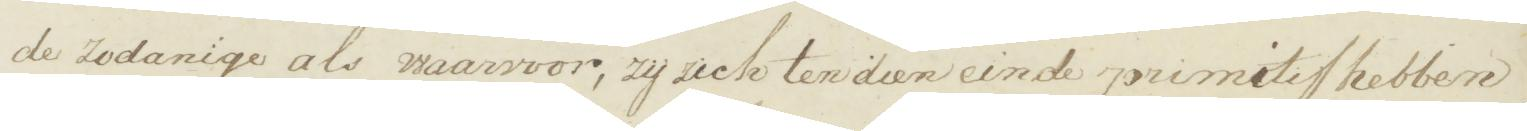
de zodanige als waarvoor, zij zich ten dien einde primitif hebben
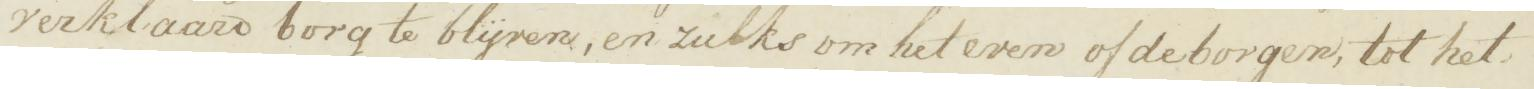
verklaard borg te blijven, en zulks om het even of de borgen, tot het
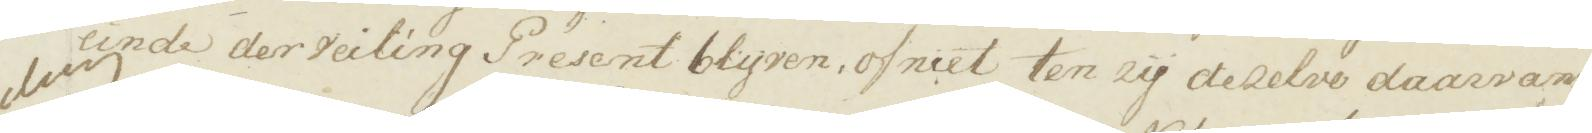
eide der veiling Present blijven, of niet, ten zij dezelve daarvan
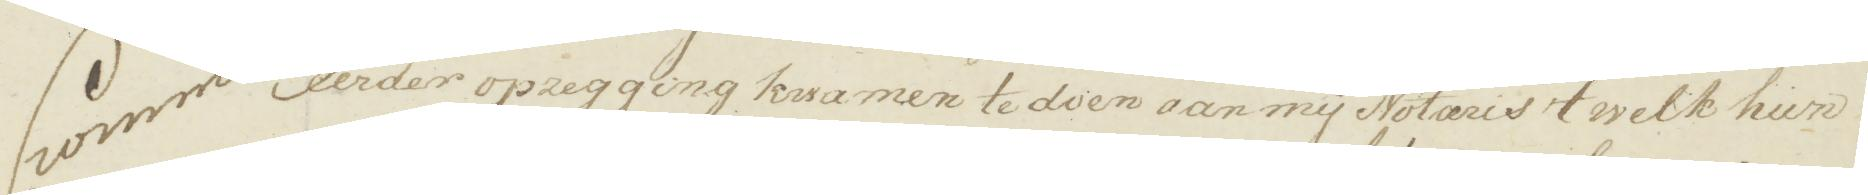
eerder opzegging kwamen te doen aan mij Notaris ’t welk hun
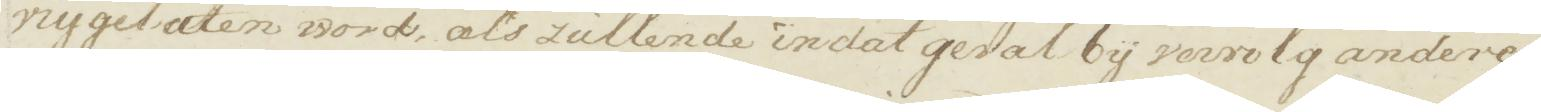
vrygelaten word, als zullende in dat geval bij vervolg andere
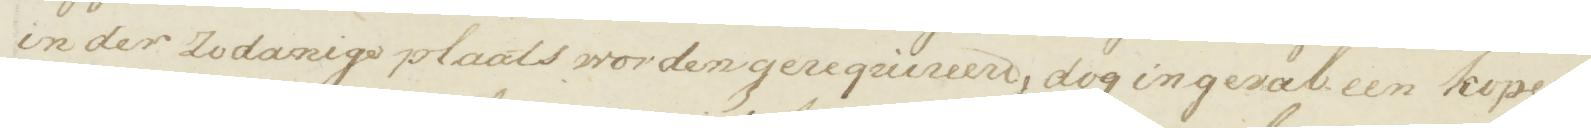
in der zodanige plaats worden gerequireerd, dog ingeval een koper
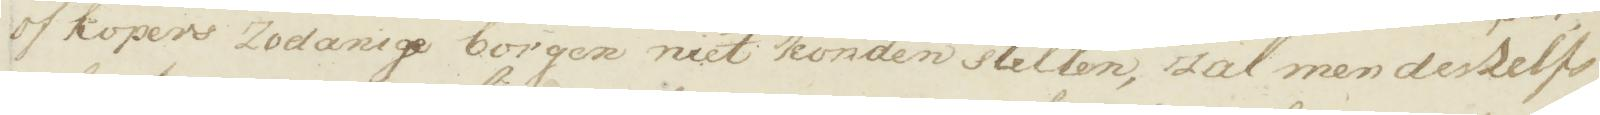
of kopers zodanige borgen niet konden stellen, zal men deszelfs
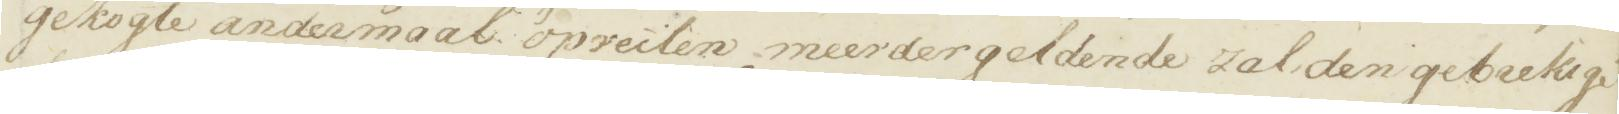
gekogte andermaal opveilen, meerder geldende zal, den gebrekige
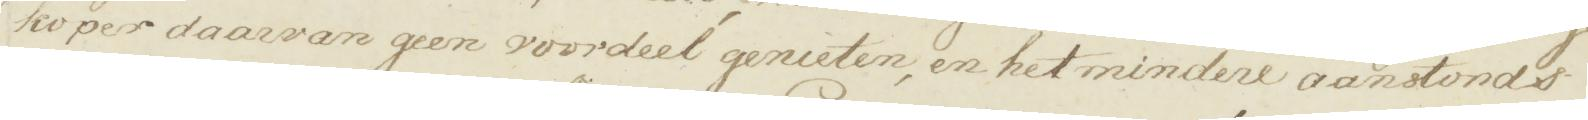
koper daarvan geen voordeel genieten, en het mindere aanstonds
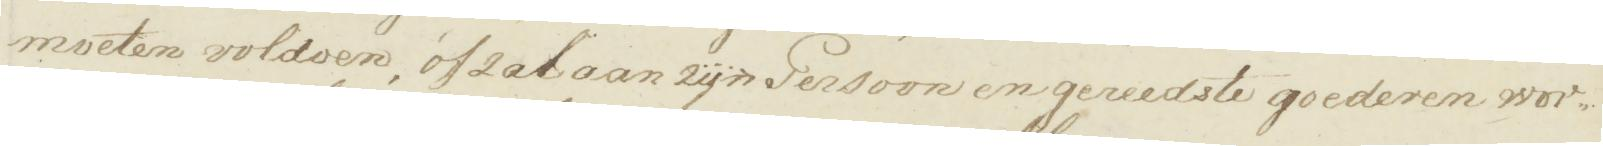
moeten voldoen, of zal aan zijn Persoon en gereedste goederen wor„
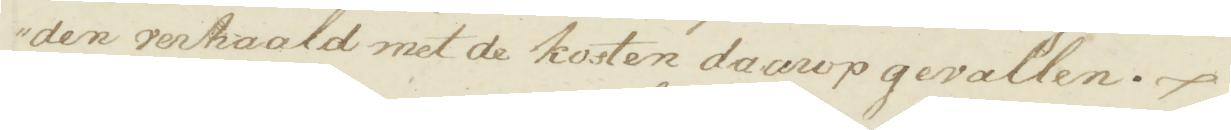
„den verhaald met de kosten daarop gevallen.—
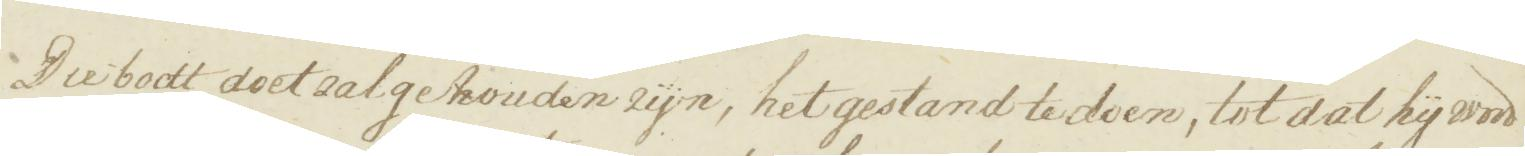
Die bodt doet zal gehouden zijn, het gestand te doen, tot dat hij word
